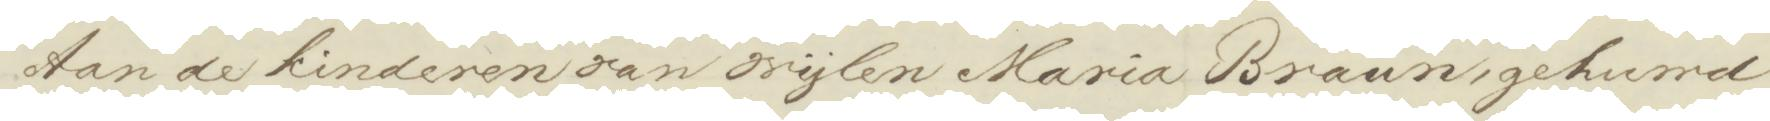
Aan de kinderen van wijlen Maria Braun, gehuwd
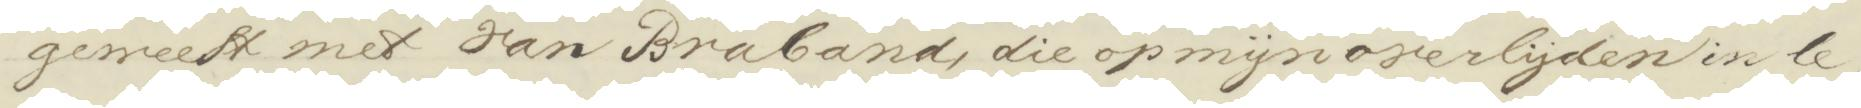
geweest met Van Braband, die op mijn overlijden in le
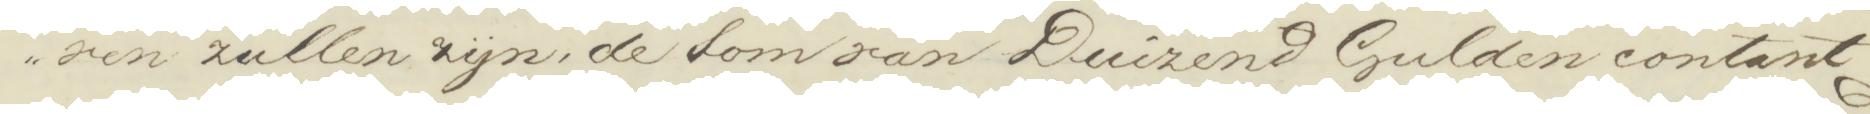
„ven zullen zijn, de som van Duizend Gulden contant
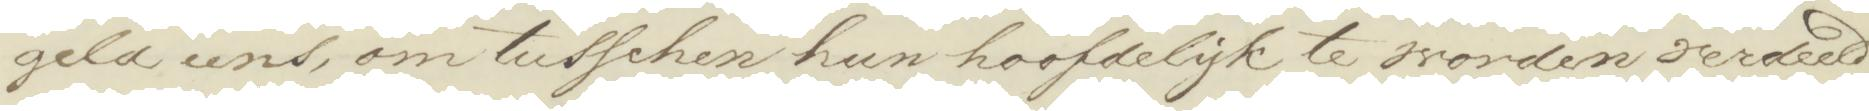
geld eens, om tusschen hun hoofdelijk te worden verdeeld
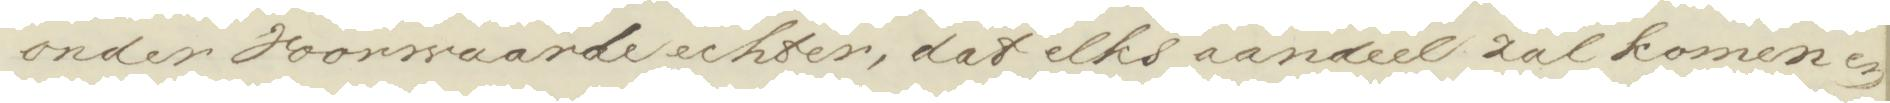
onder voorwaarde echter, dat elks aandeel zal komen en
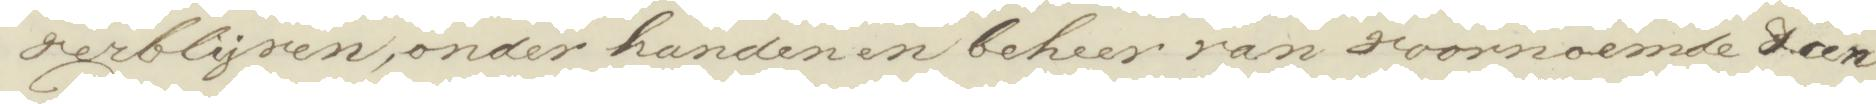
verblijven, onder handen en beheer van voornoemde Ian
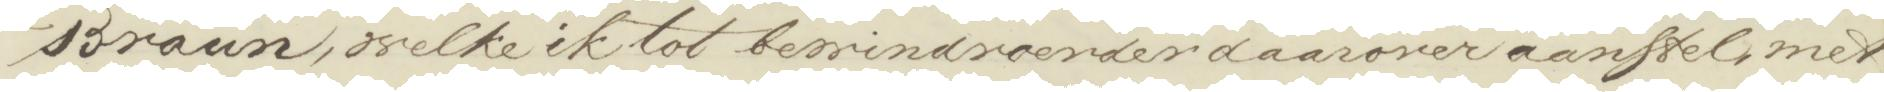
Braun, welke ik tot bewindvoerder daarover aanstel, met
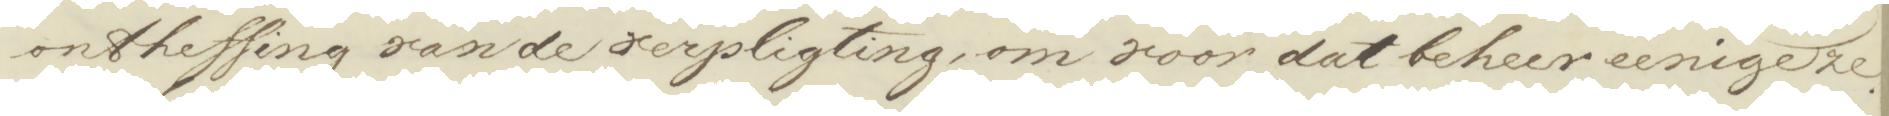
ontheffing van de verpligting, om voor dat beheer eenige ze.
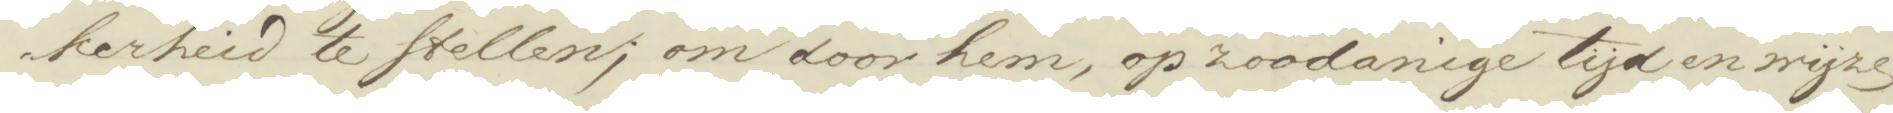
„kerheid te stellen, om door hem, op zoodanige tijd en wijze
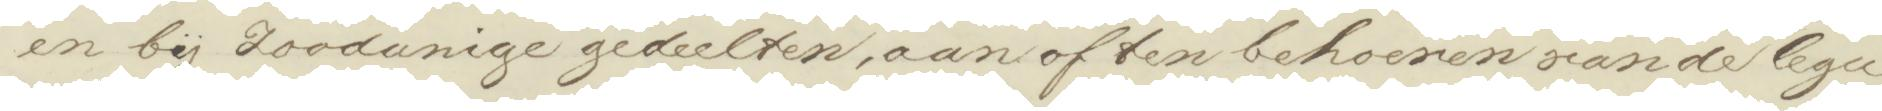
en bij zoodanige gedeelten, aan of ten behoeven van de lega
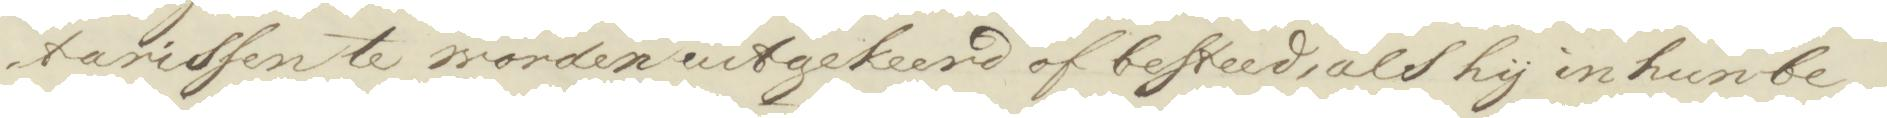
„tarissen te worden uitgekeerd of besteed, als hij in hun be
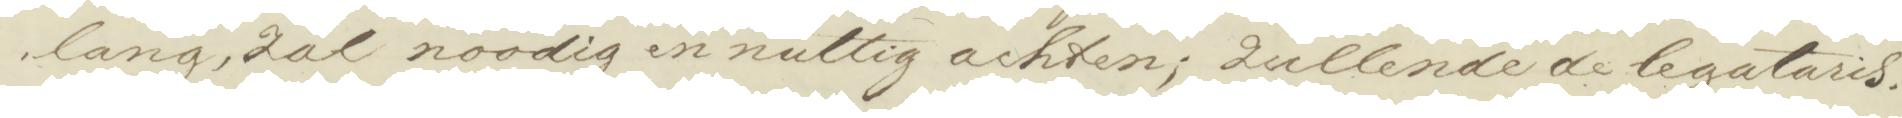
,lang, zal noodig en nuttig achten; zullende de legataris
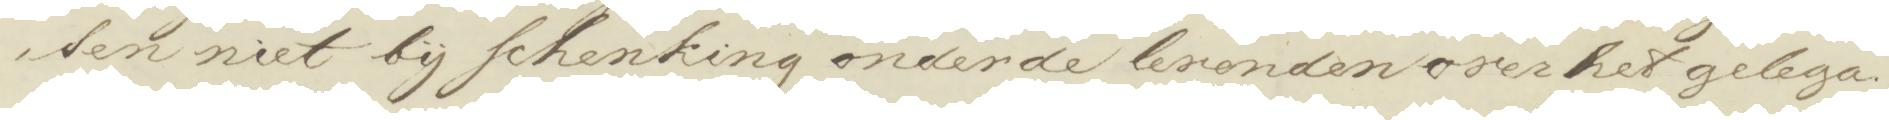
,sen niet bij schenking onder de levenden over het gelega
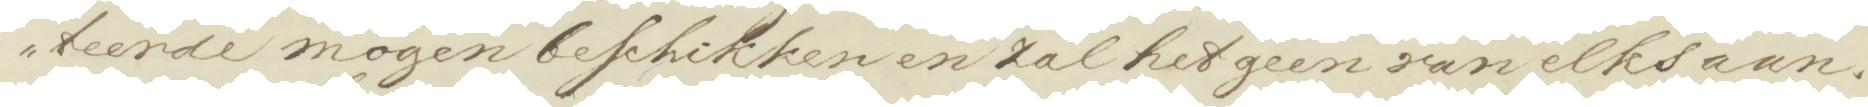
„teerde mogen beschikken en zal het geen van elks aan
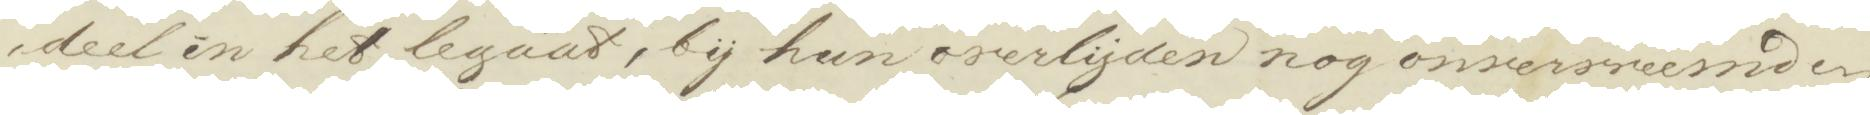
„deel in het legaat, bij hun overlijden nog onvervreemd en
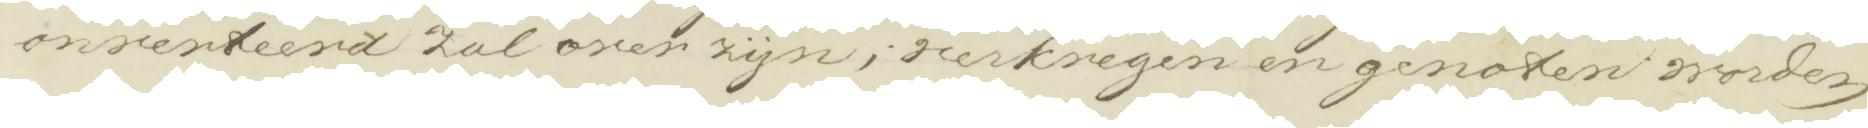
onverteerd zal over zijn, verkregen en genoten worden
